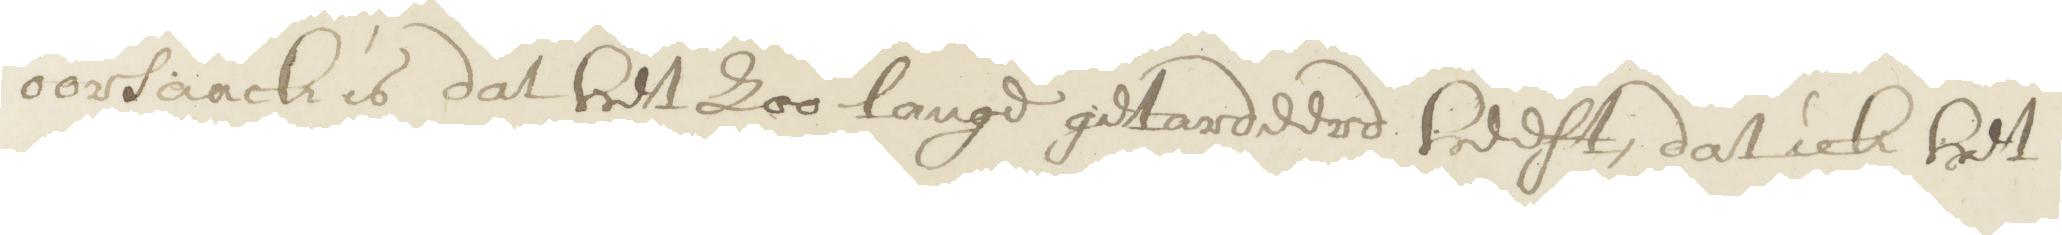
oorsaack is dat het zoo lange getardeerd heeft, dat ick het
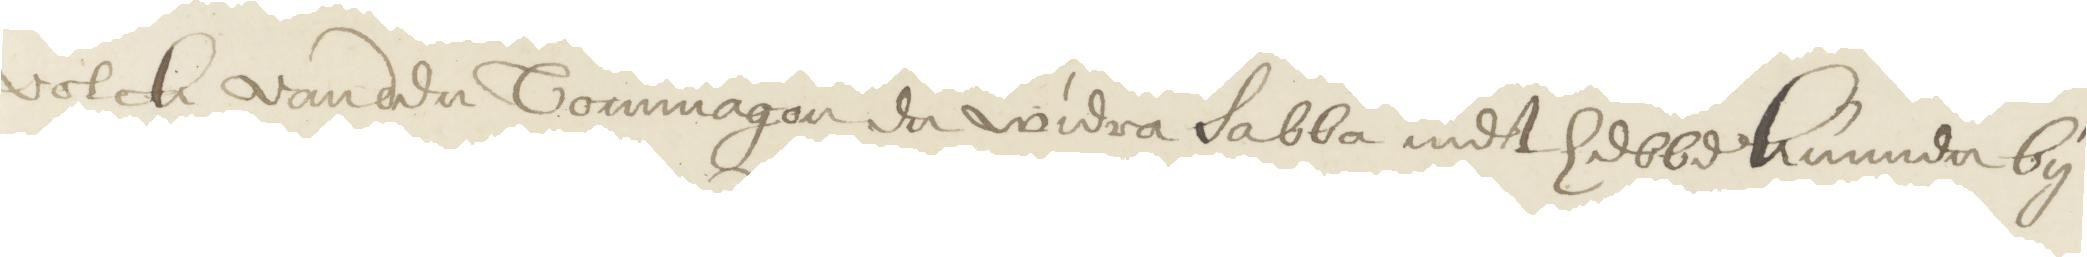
volck van den Tommagon en wiera sabba niet hebbe kunnen bij
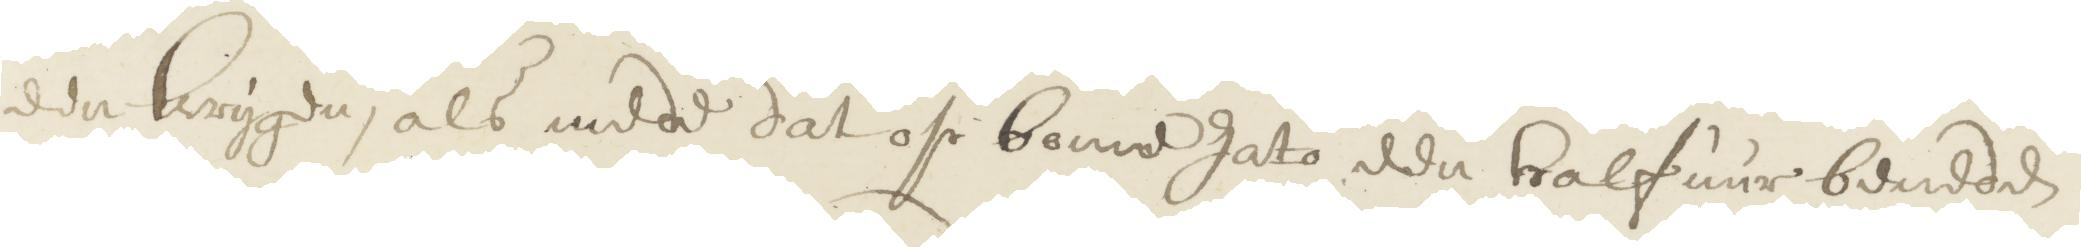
een krijgen, als mede dat op bome Jato een halfuur beneden
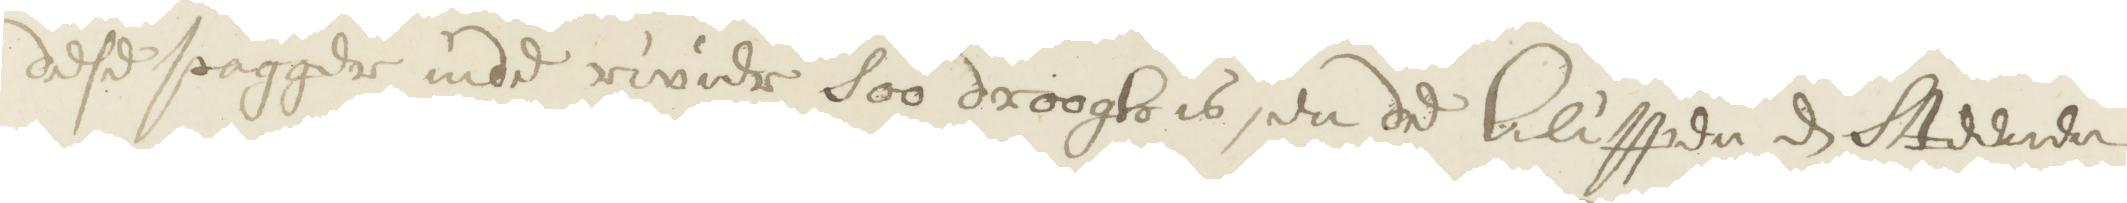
dese pagger inde rivier soo droogh is, en de klippen en steenen
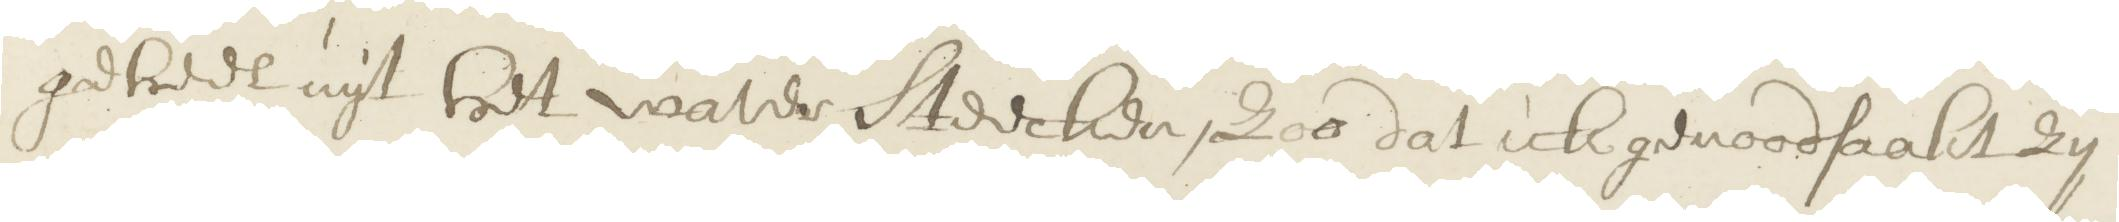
geheel uijt het water steecken, zoo dat ick genoodsaakt zij
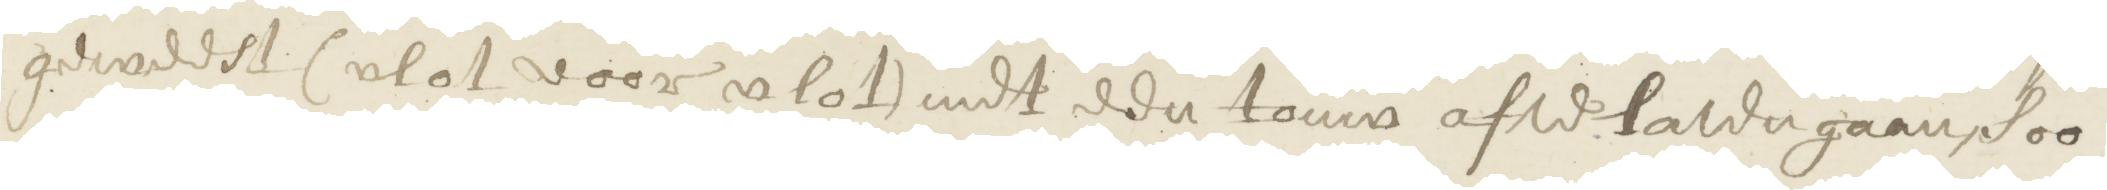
geweest (vlot voor vlot) met een touw afte laten gaan, soo
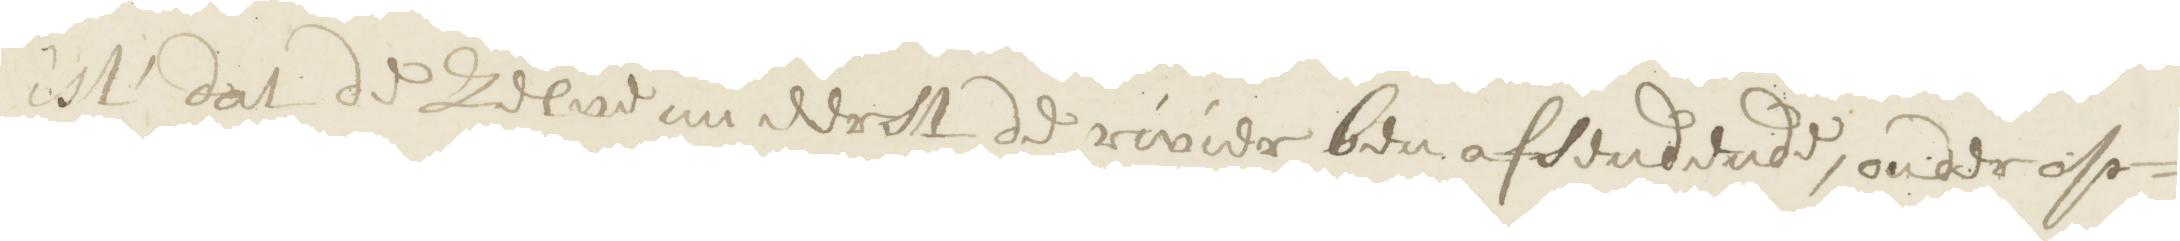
is t' dat de zelve nu eerst de rivier ben afsendende, onder op„
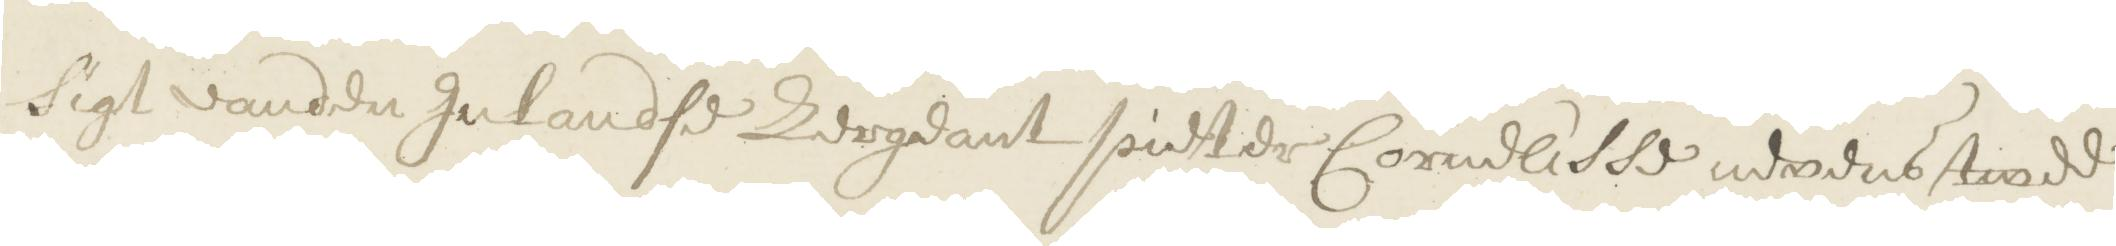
sigt van den Jnlandse zergeant pieter Cornelisse nevens twee
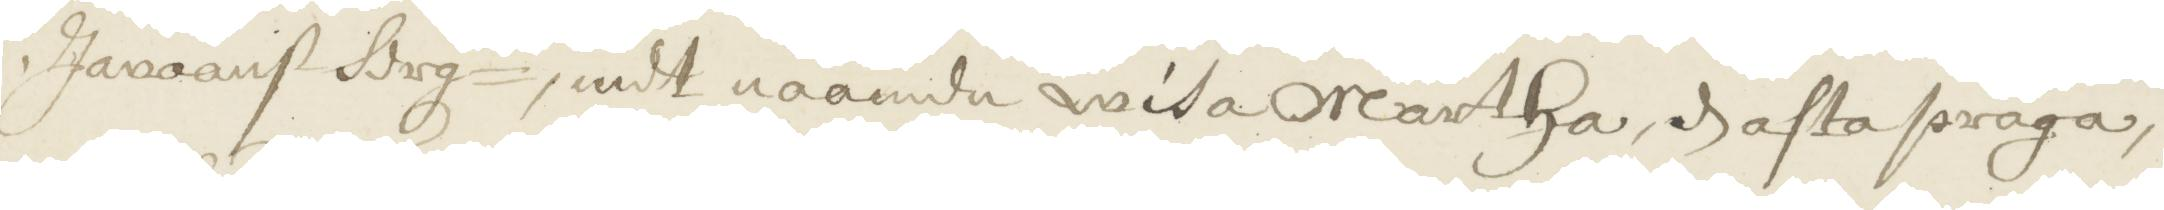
Javaans serg=ts, met naamen wisa Martha, en asta praga,
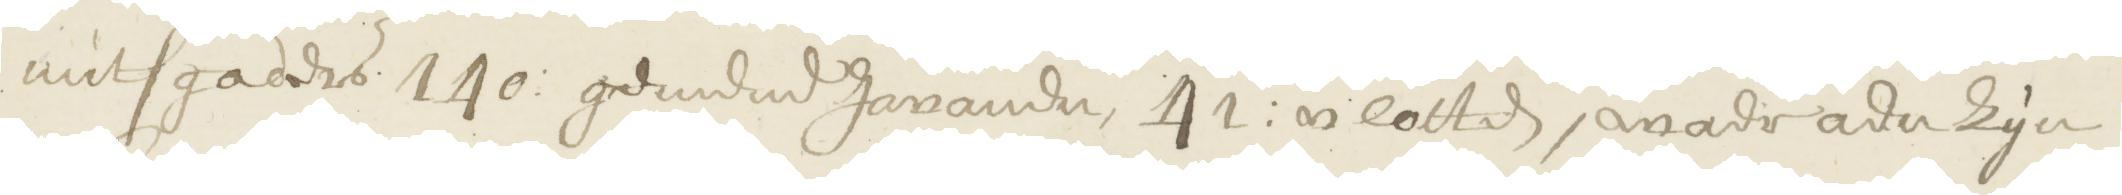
mitsgaders 140: gemene Javanen, 41: vlotten, waer aen zijn
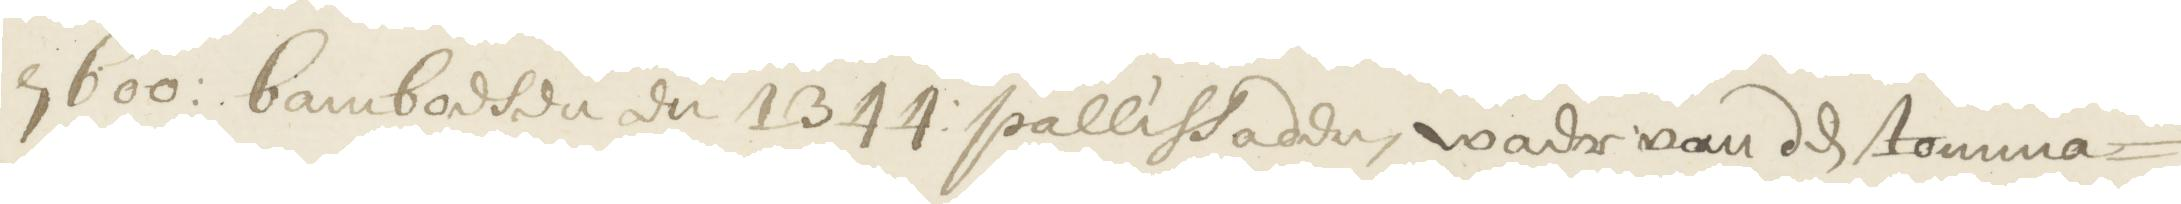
7600: bamboesen en 1344: pallissaden, waer van den tomma„
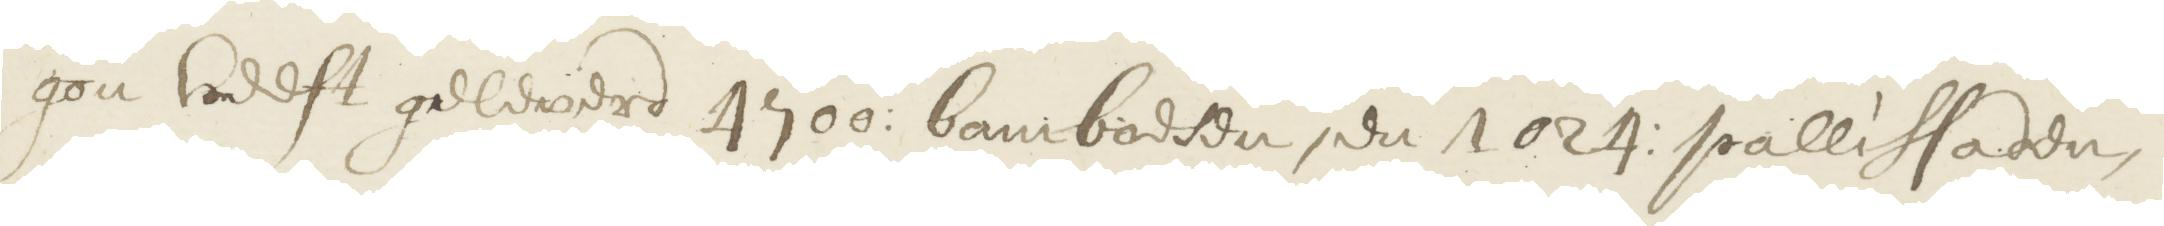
gon heeft geleverd 4700: bamboesen, en 1024: pallissaden,
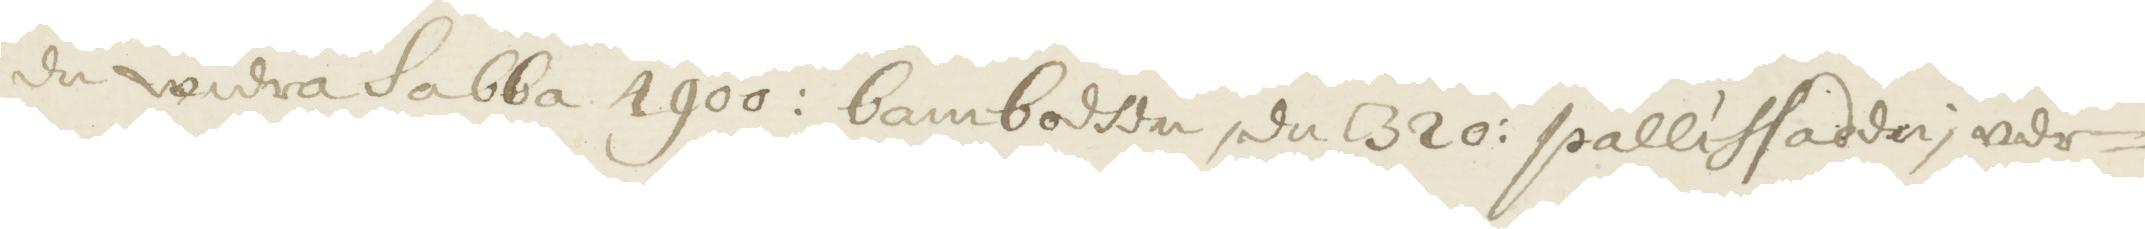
en wiera sabba 4900: bamboesen, en 320: pallissaden; ver„
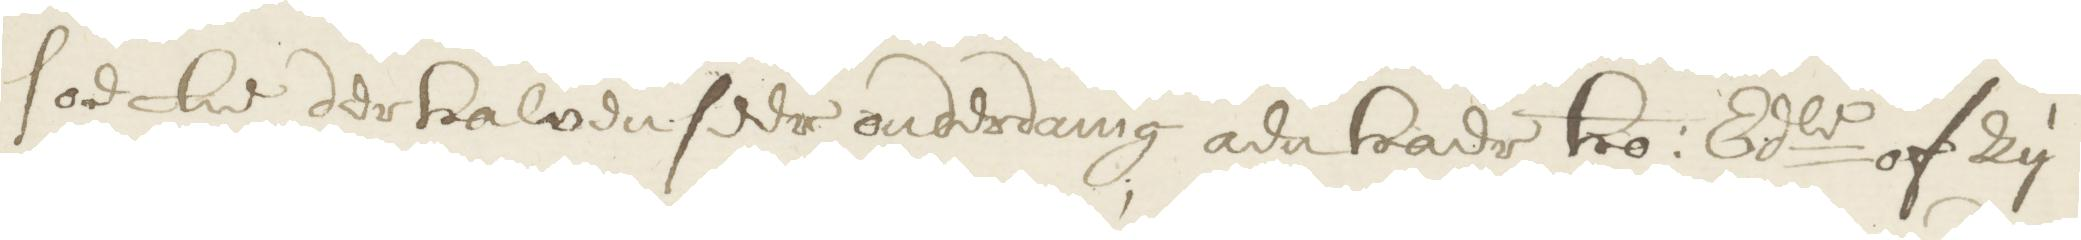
soecke derhalven seer onderdanig aen haer ho: Ed=le of zij
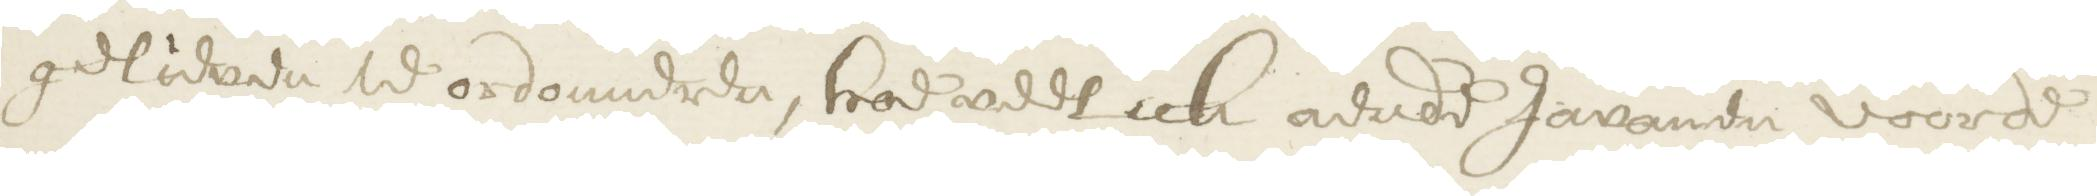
gelieven te ordonneren, hoe veel ick aende Javanen voorde
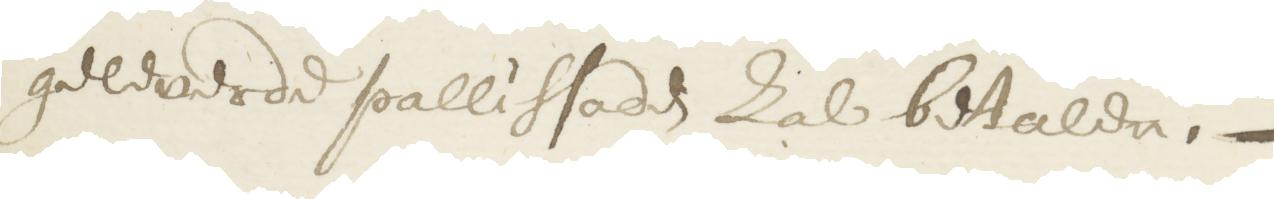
geleverde pallissaden zal betalen. —
